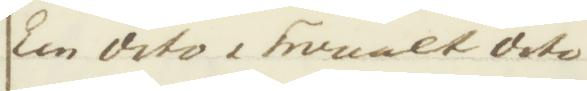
Een dito & Twaalf dito
